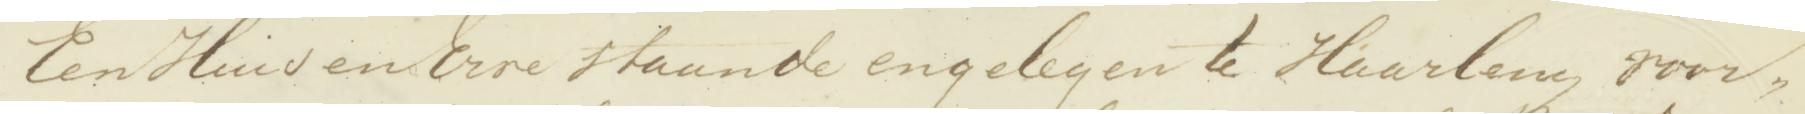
Een Huis en Erve staande en gelegen te Haarlem voor„
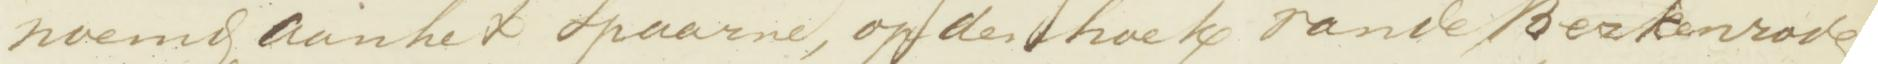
noemd Aan het spaarne, op de hoek van de Berkenrode
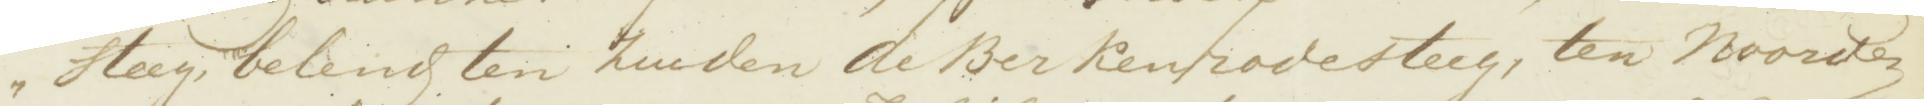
„steeg belend ten zuiden de Berkenrodesteeg, ten Noorden
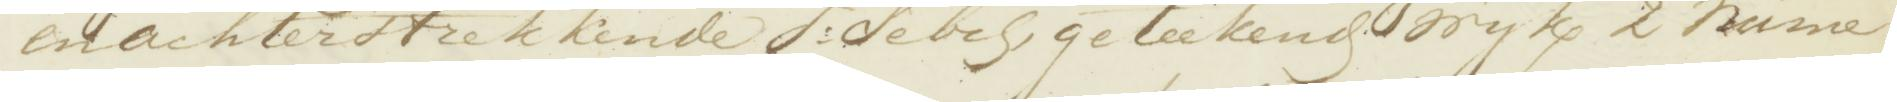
en achterstrekkende J: Sebil geteekend Wijk 2 Nume
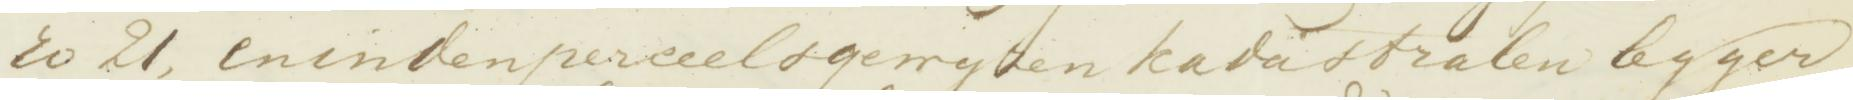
ro 21, en in den perceels gewyzen kadastralen legger
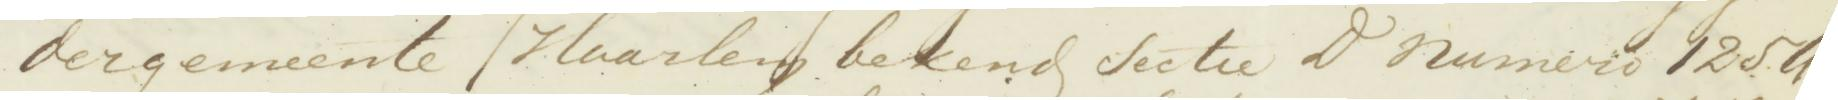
der gemeente Haarlem bekend sectie D Numero 1254.
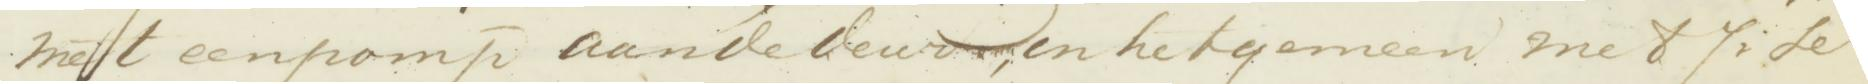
met een pomp aan de deur, en het gemeen met J: se
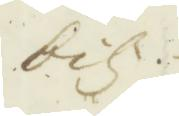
bil.
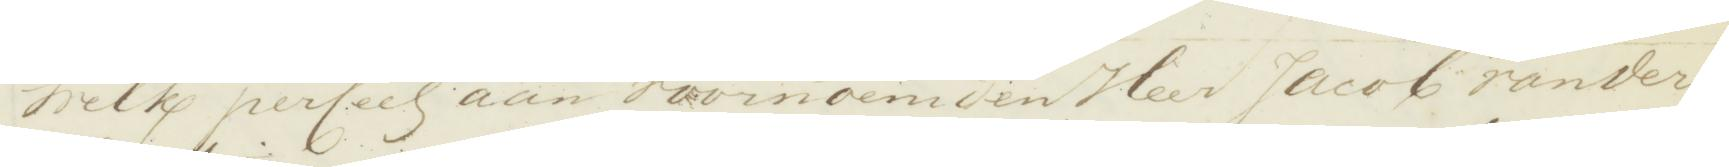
welk perceel aan voornoemden Heer Jacob van der
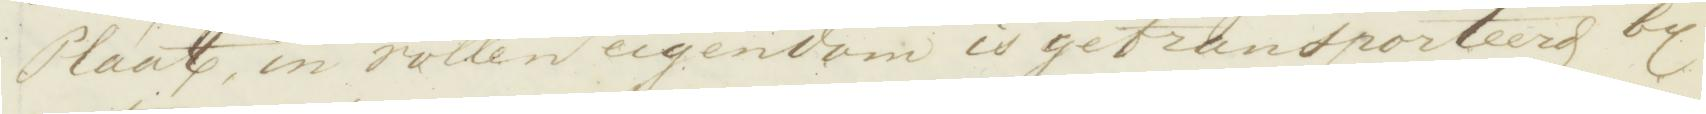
Plaat, in vollen eigendom is getransporteerd by
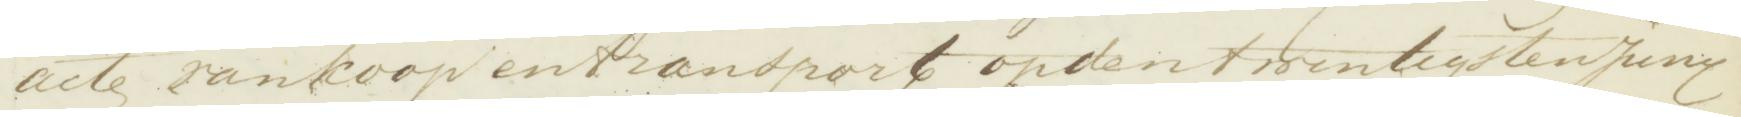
acte van koop en transport op den twintigsten Juny
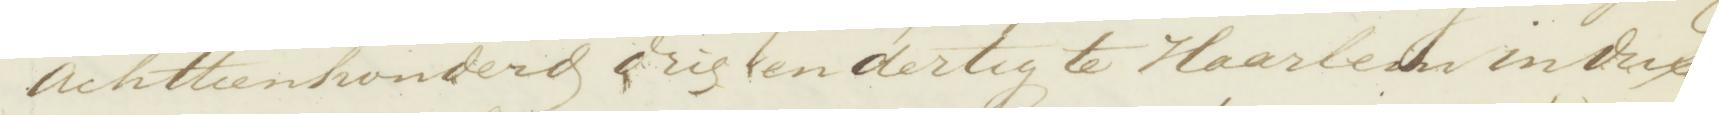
achttienhonderd drie en dertig te Haarlem in dub
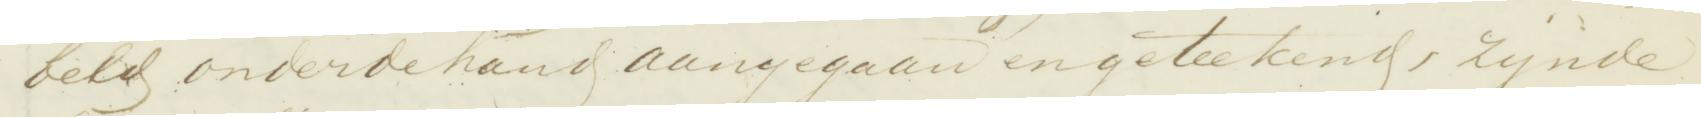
beld onder de hand aangegaan en geteekend, zynde
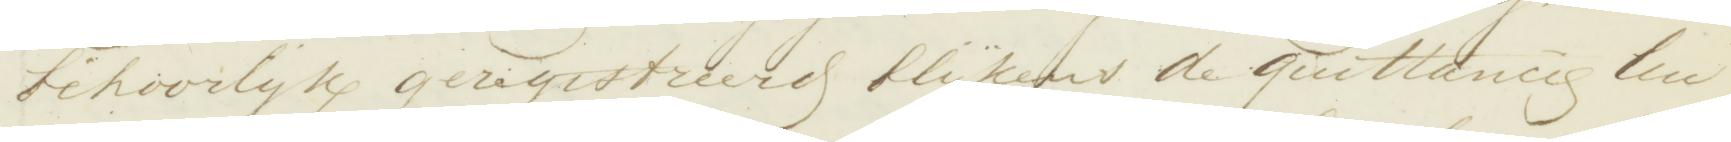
behoorlyk geregistreerd blijkens de quittancie len
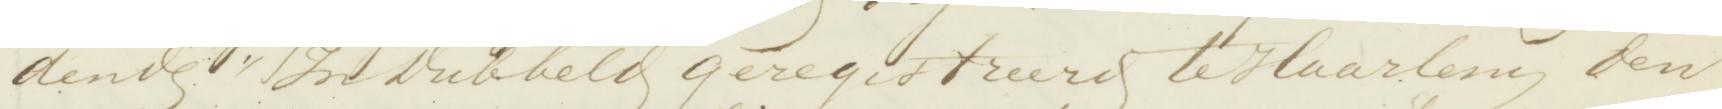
dende. In dubbeld geregistreerd te Haarlem, den
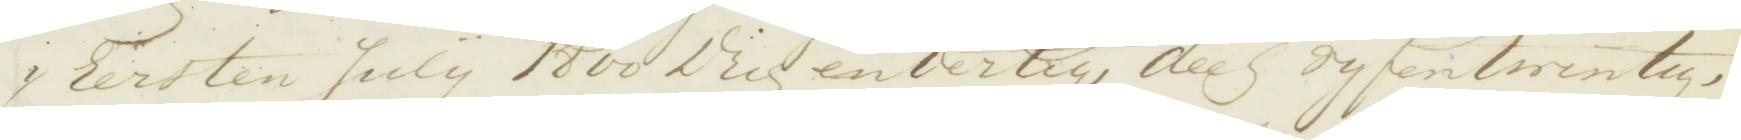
„ Eersten Julij 1800 Drie en dertig, dees vyfentwintig,
